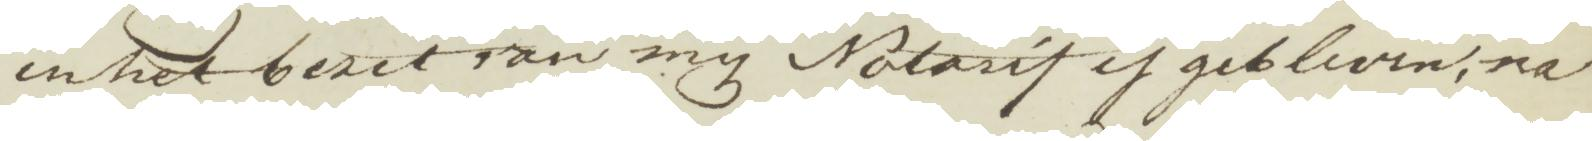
in het bezit van my Notaris is gebleven, na
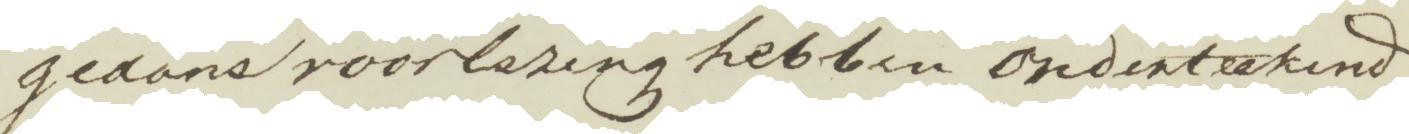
gedane voorlezing hebben onderteekend
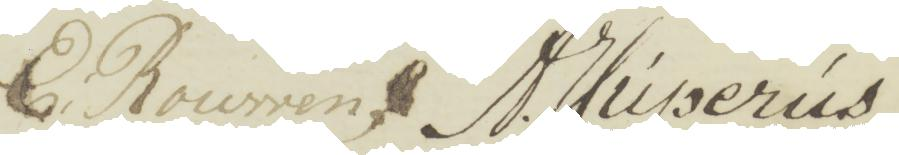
E: Bouwen A.J. Cuperus
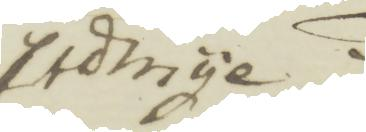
J vd mije
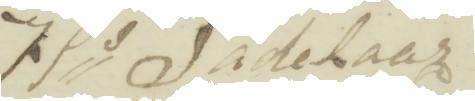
H„s Sadelaar
